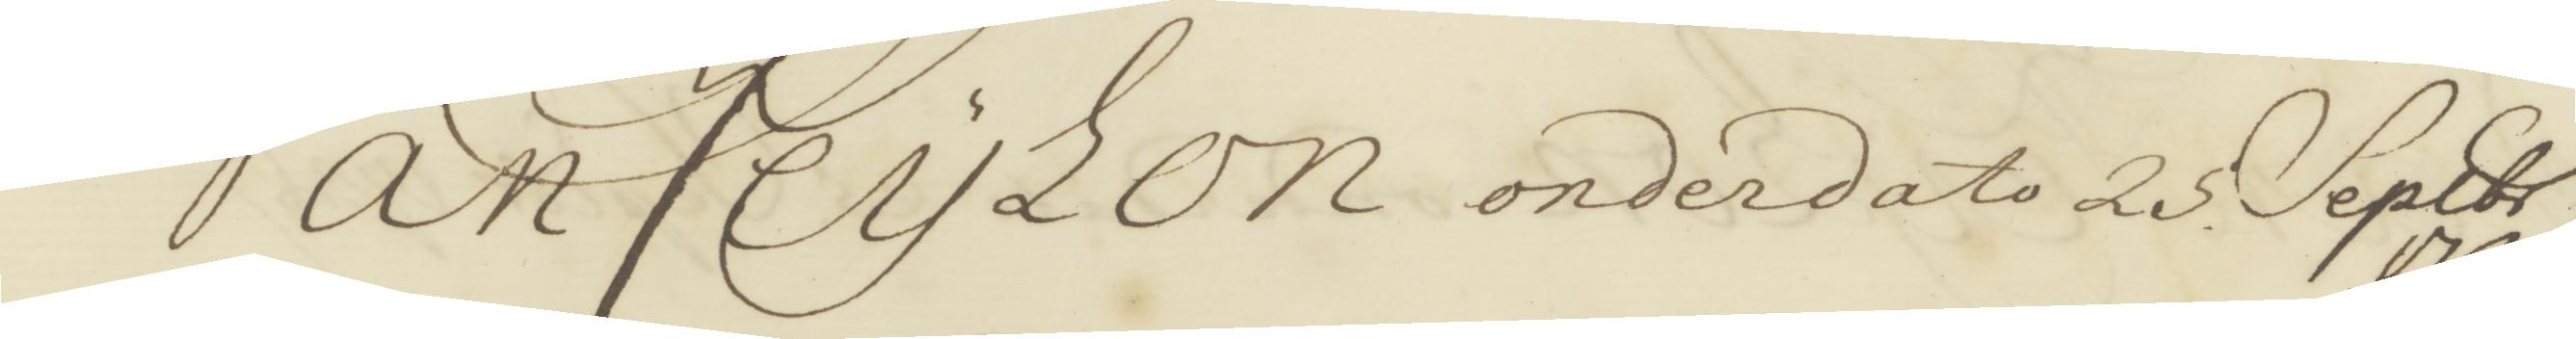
Van Ceijlon onderdato 25. Septbr
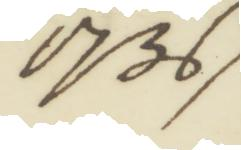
1736/
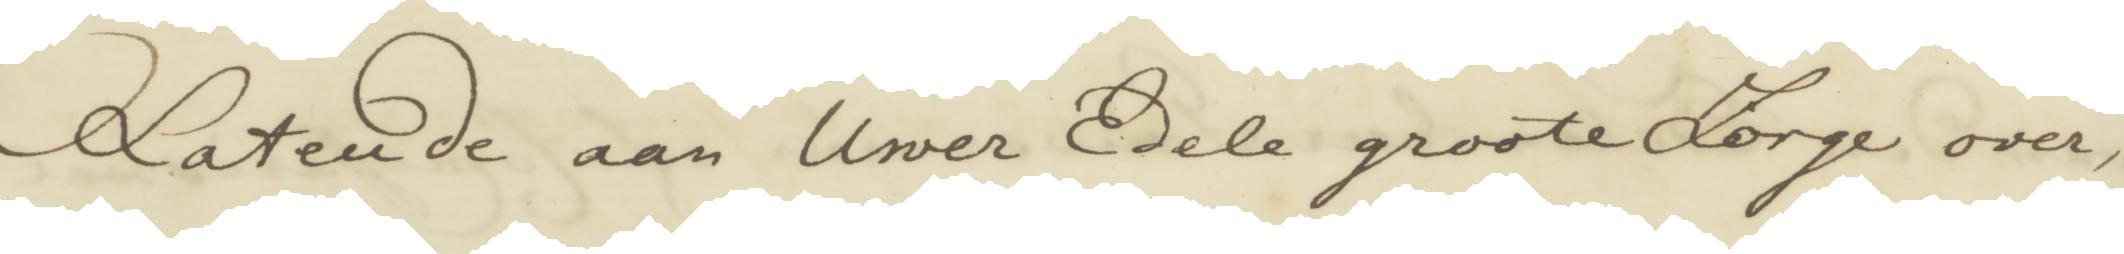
Latende aan Uwer Edele groote Zorge over,
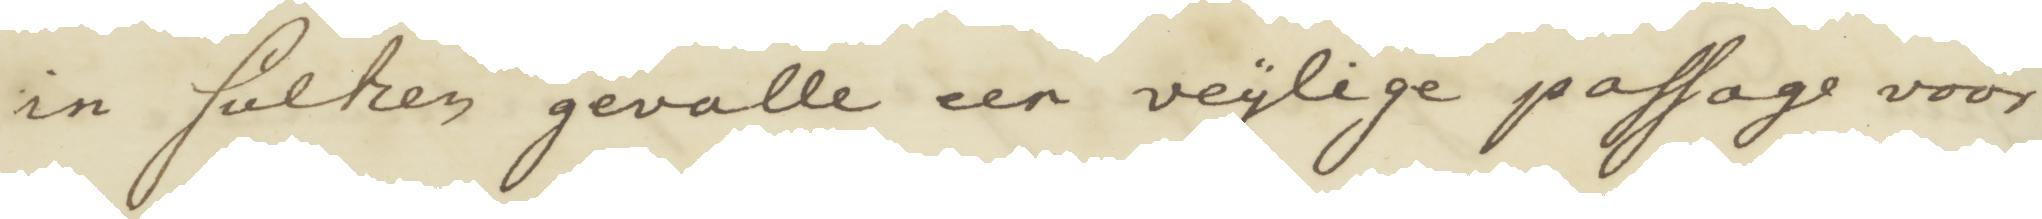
in sulken gevalle een veijlige passage voor
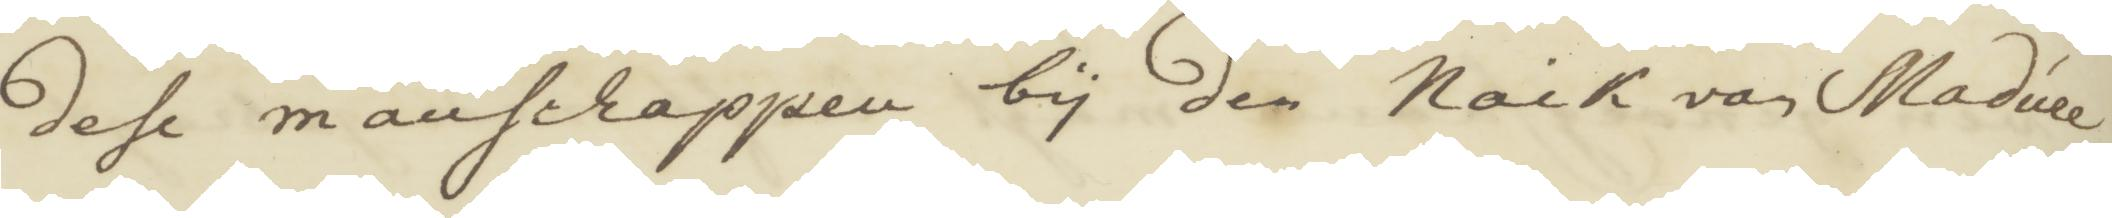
dese manschappen bij den Naik van Maduee
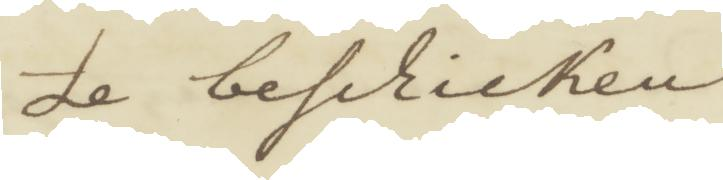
te beschicken
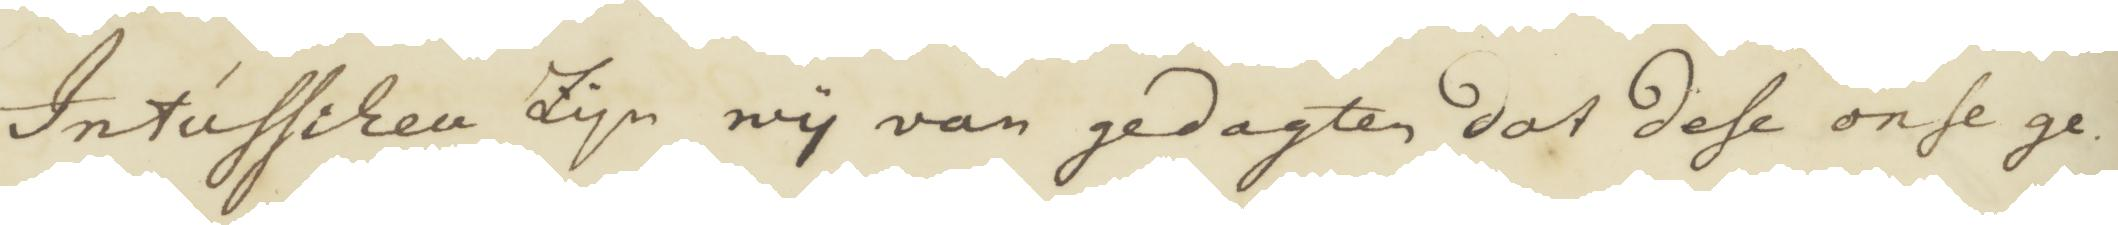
Intusschen zijn wij van gedagten dat dese onse g.
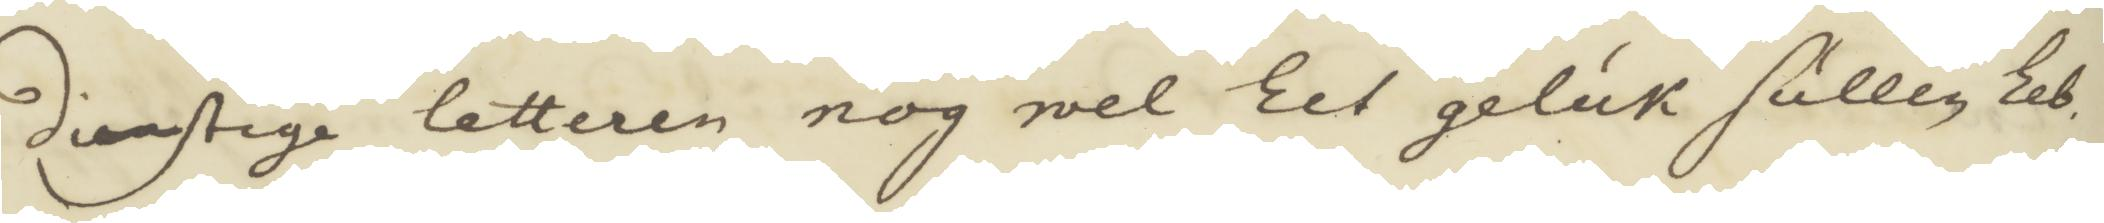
dienstige letteren nog wel het geluk sullen heb,
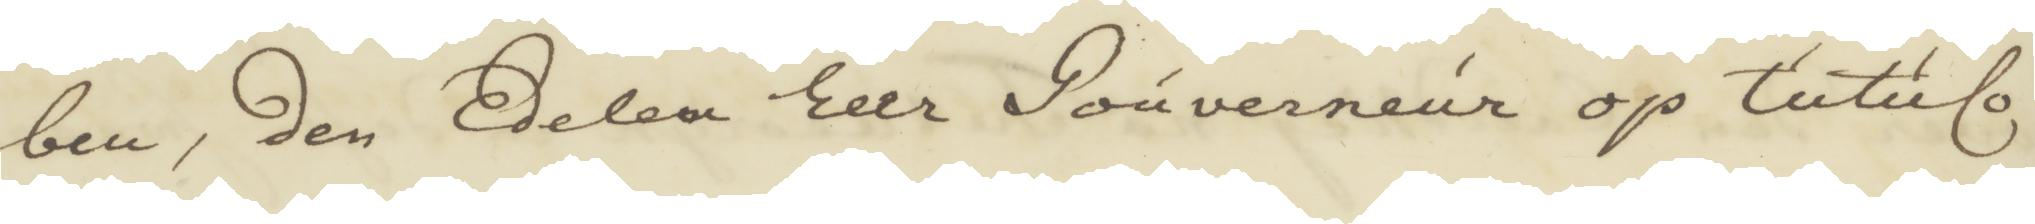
ben, den Edelen heer Gouverneur op tutuco
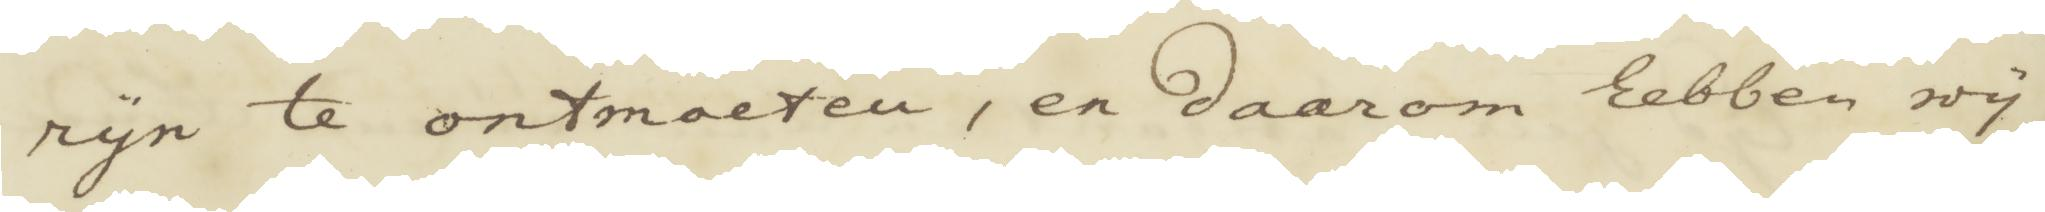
rijn te ontmoeten, en daarom hebben wij
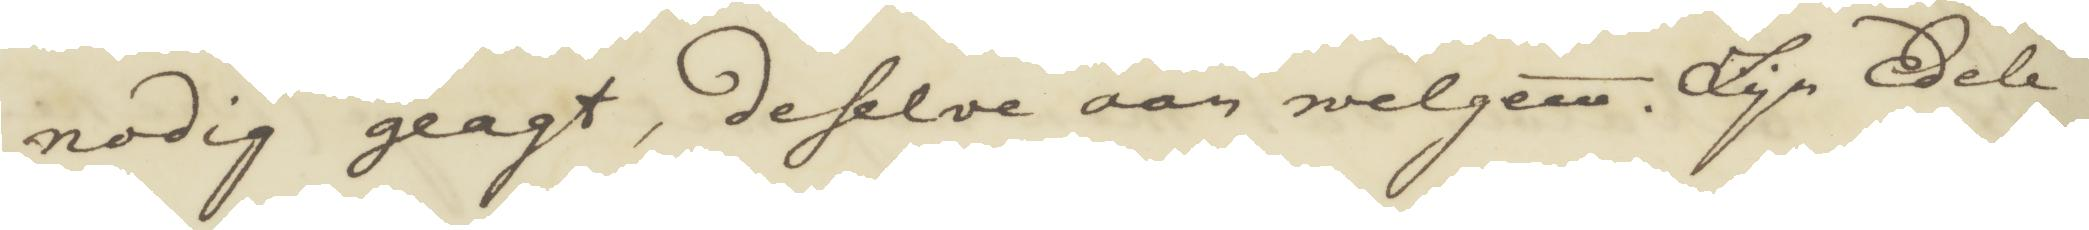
nodig geagt, deselve aan welgem: zijn Edele
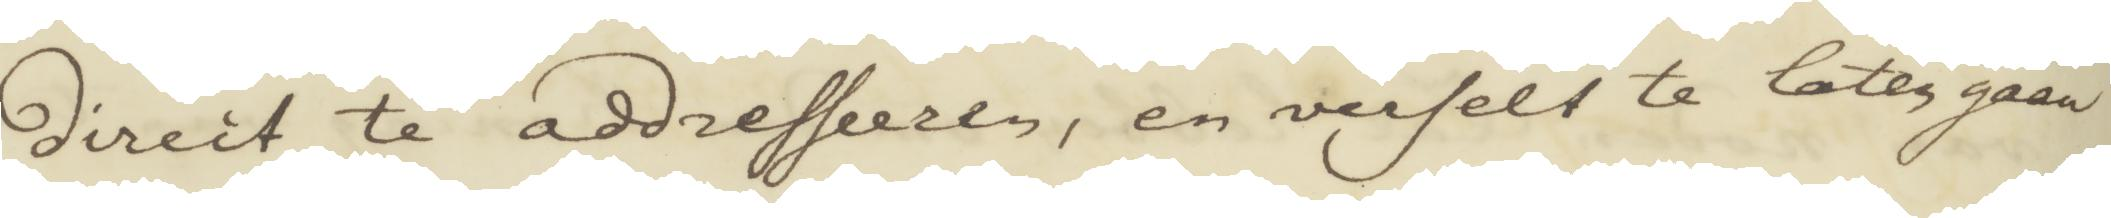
direct te addresseeren, en verselt te laten gaan
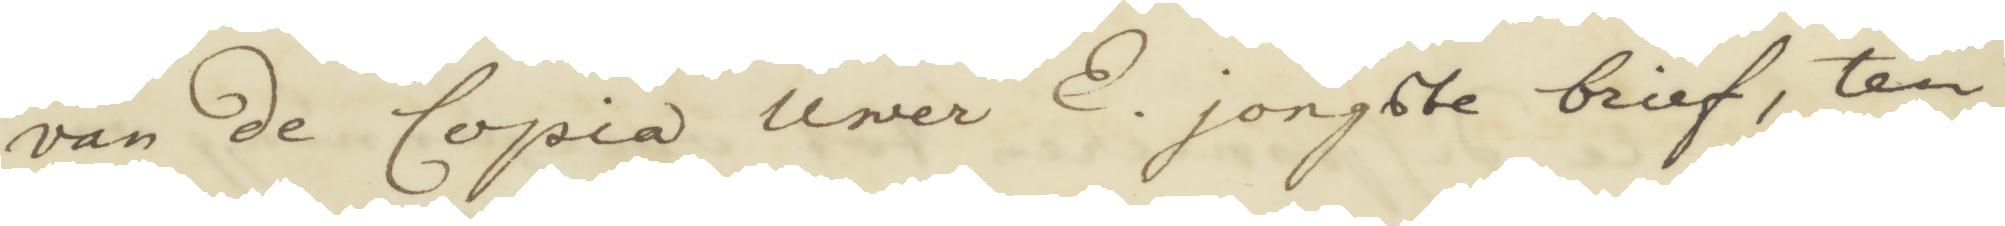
van de Copia Uwer E. jongste brief, ten
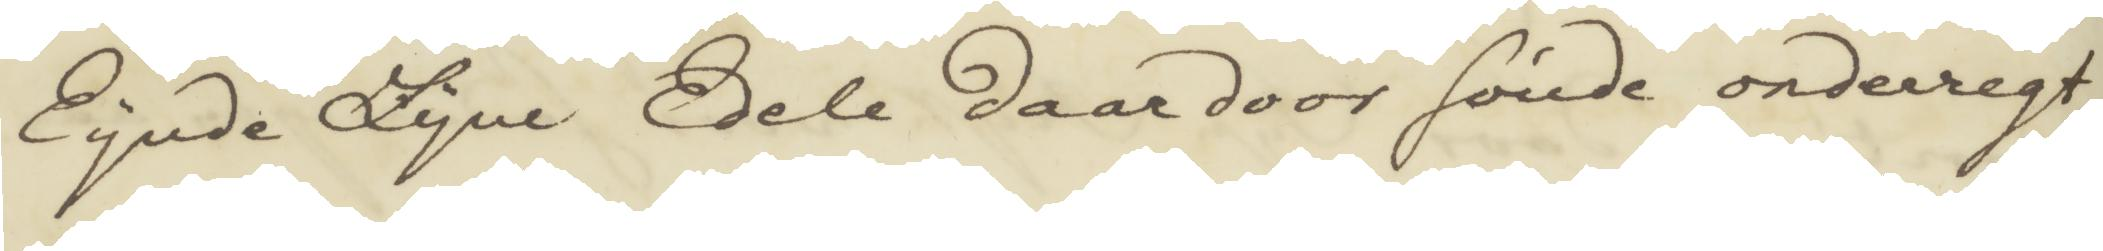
Eijnde zijne Edele daar door soude onderregt
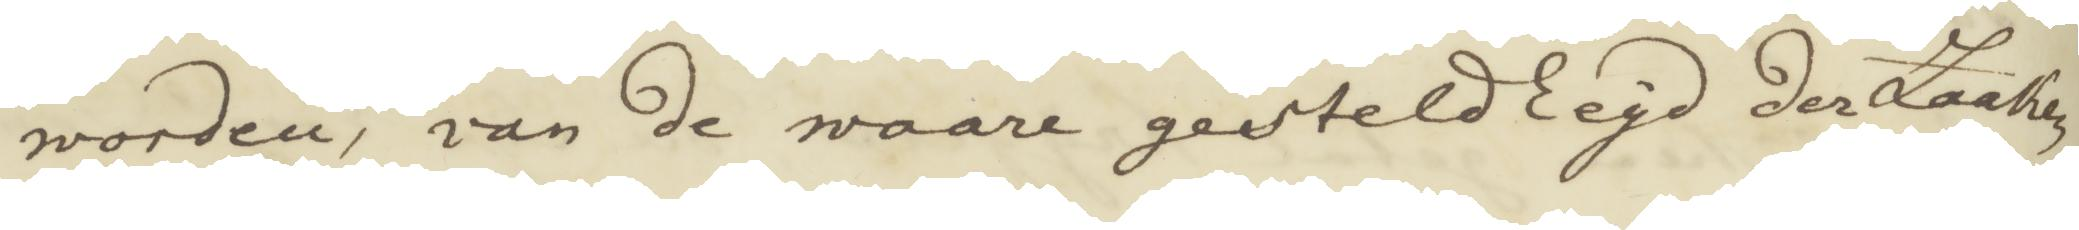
worden, van de waare gesteldheijd der zaaken
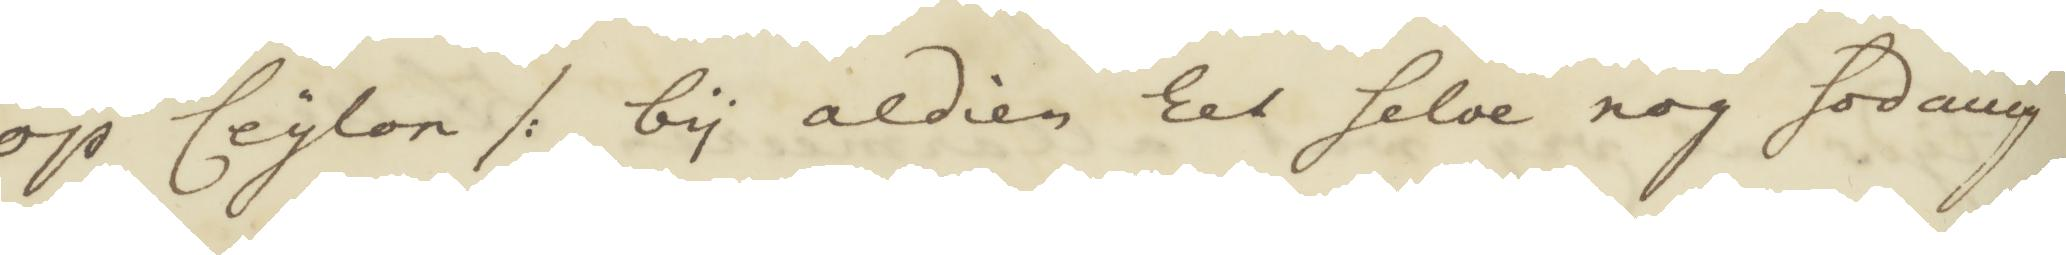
op Ceijlon /:bij aldien het selve nog sodanig
